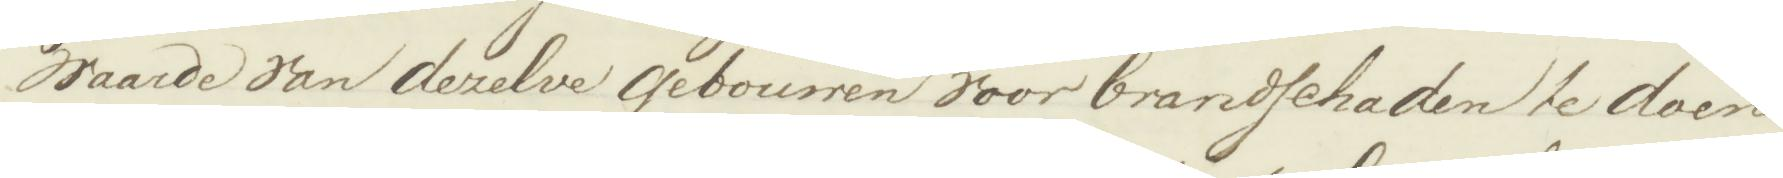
waarde van dezelve gebouwen voor brandschaden te doen
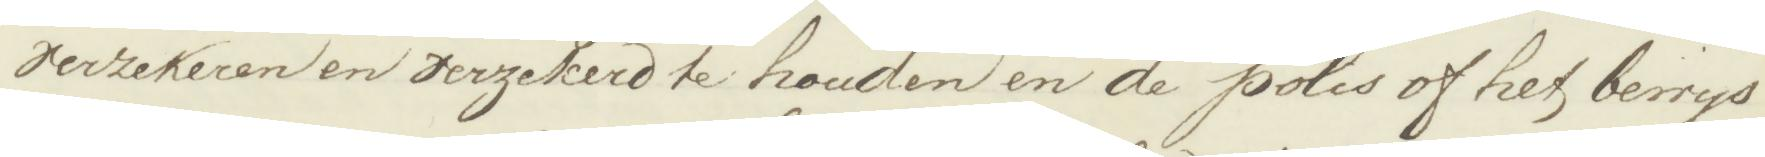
verzekeren en verzekerd te houden en de polis of het bewys
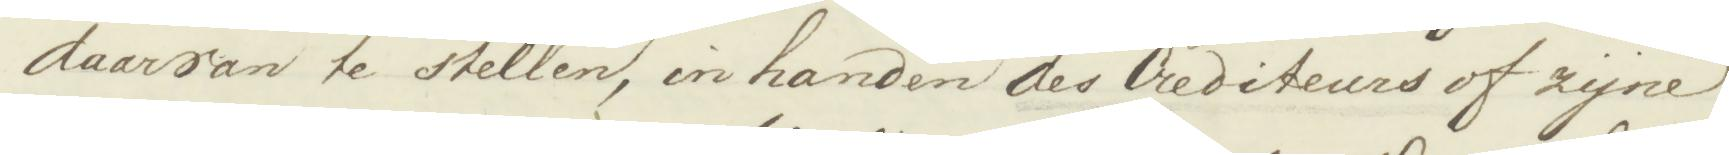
daarvan te stellen, in handen des Crediteurs of zijne
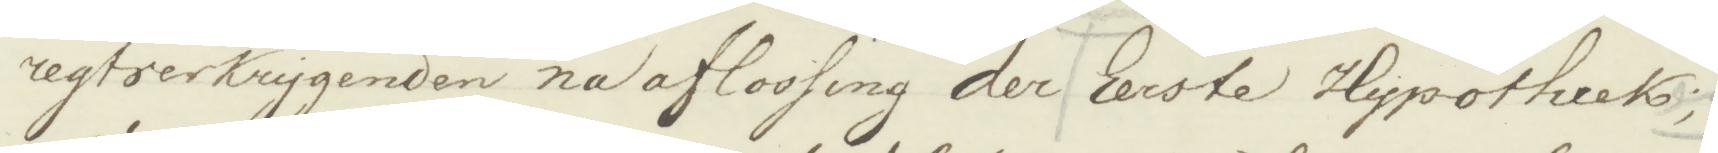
regtverkrijgenden na aflossing der ¶ Eerste Hijpotheeken;
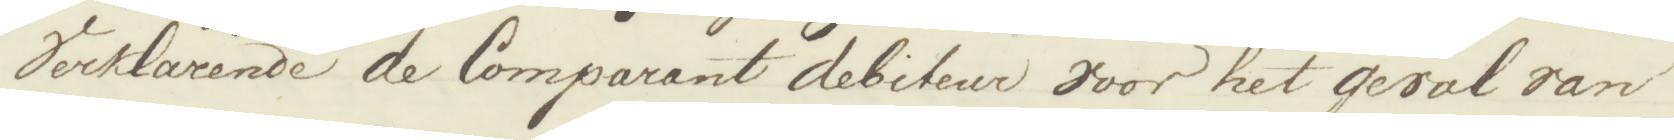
Verklarende de Comparant debiteur voor het geval van
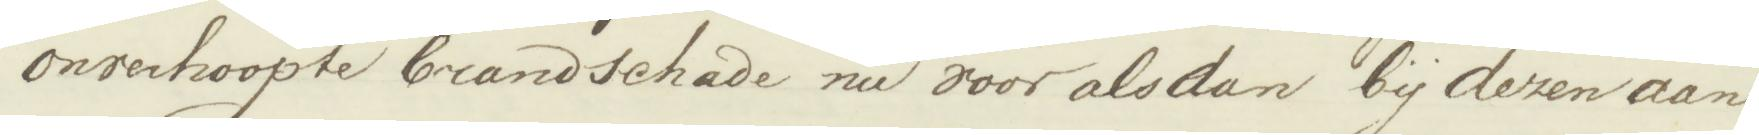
onverhoopte brandschade nu voor als dan bij dezen aan
